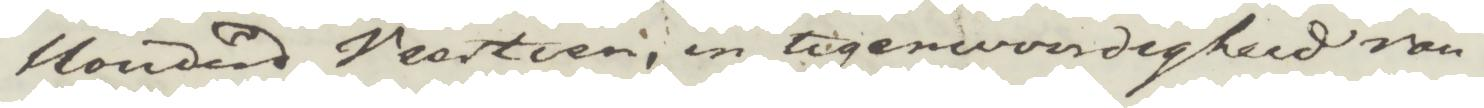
Honderd Veertien, in tegenwoordigheid van
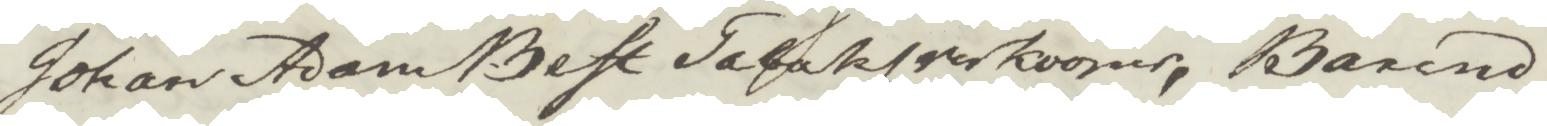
Johan Adam Best, Tabaks verkooper, Barend
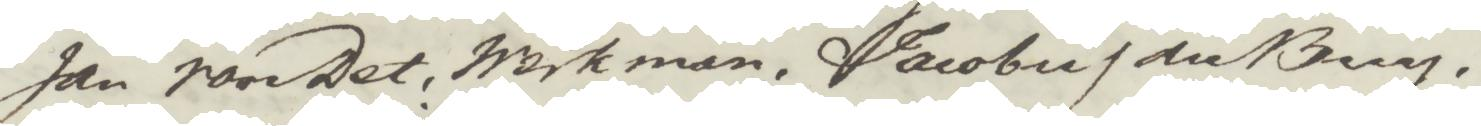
Jan van Det, Werkman, Jacobus du Buy
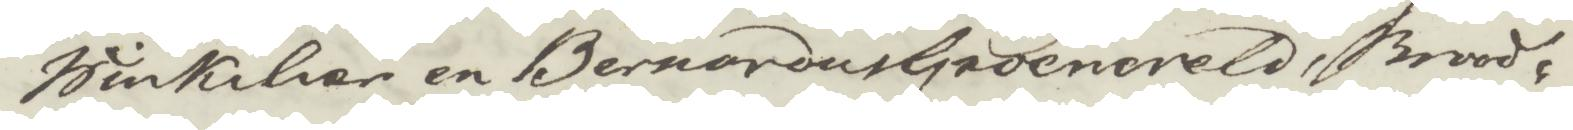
Winkelier en Bernardus Groeneveld, Brood„
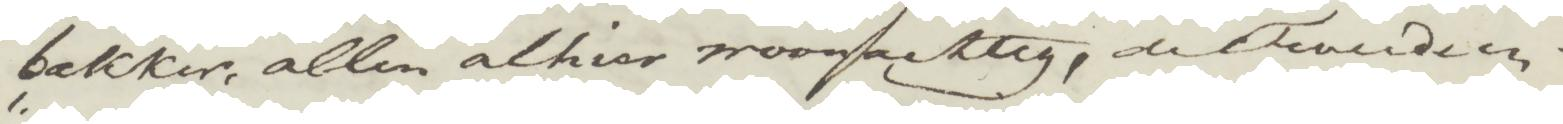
bakker, allen alhier woonachtig, de Tweede in
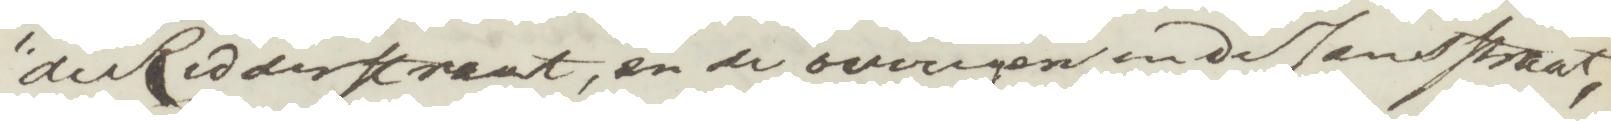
de Ridderstraat, en de overigen in de Jansstraat,
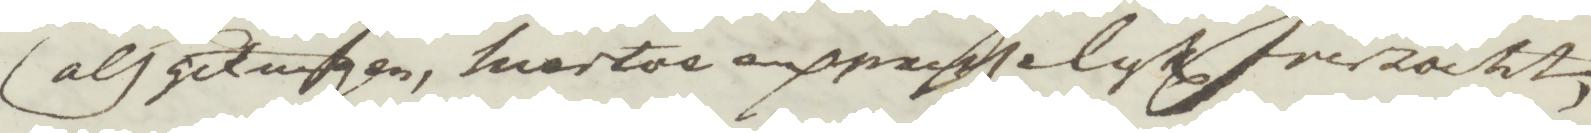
als getuigen, hiertoe expresselyk verzocht,
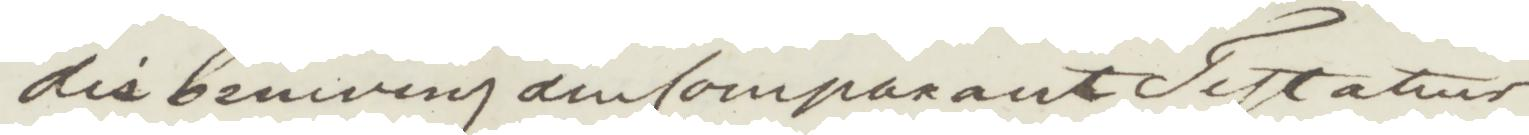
die benevens den Comparant Testateur
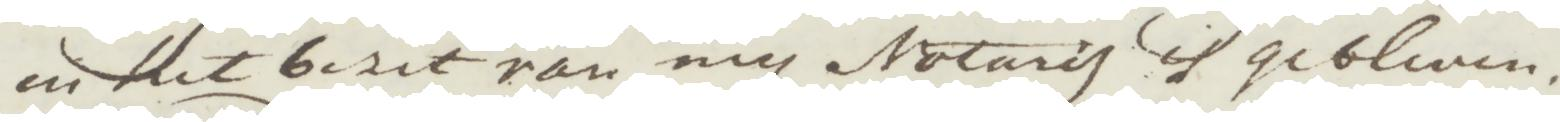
in het bezit van my Notaris is gebleven,
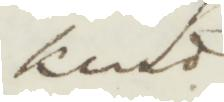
=kend
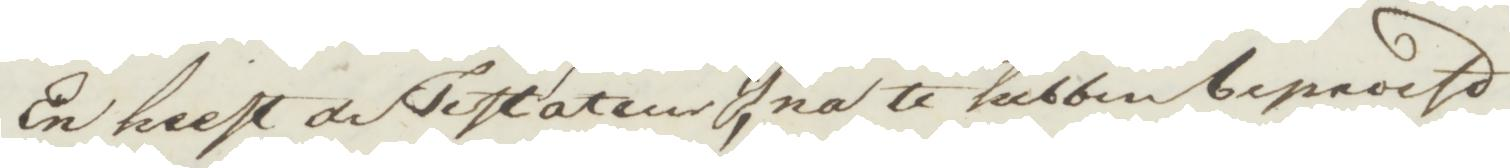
En heeft de Testateur, na te hebben beproefd
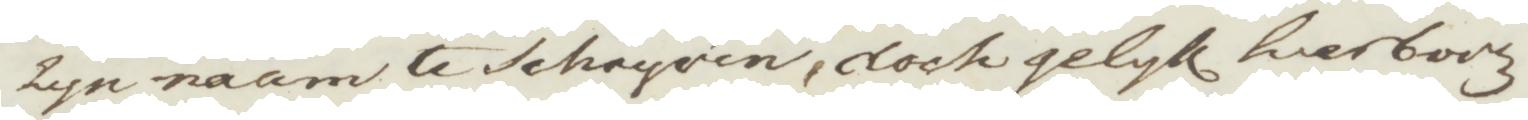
zyn naam te schryven, doch gelyk hier boven
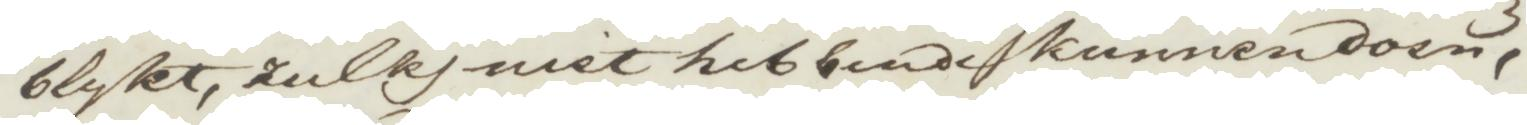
blykt, zulks niet hebbende kunnen doen,
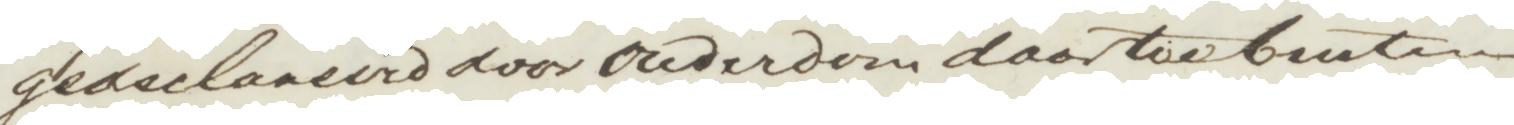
gedeclareerd door ouderdom daartoe buiten
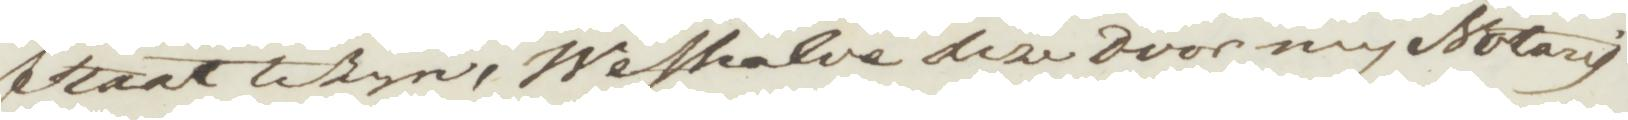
staat te zyn, weshalve deze door my Notaris
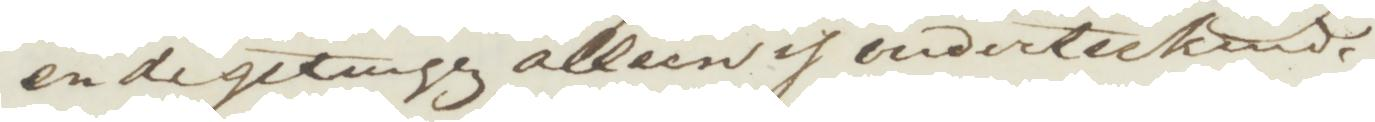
en de getuigen alleen is onderteekend,
